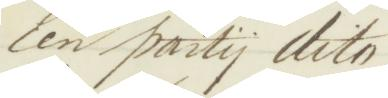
Een partij dito
